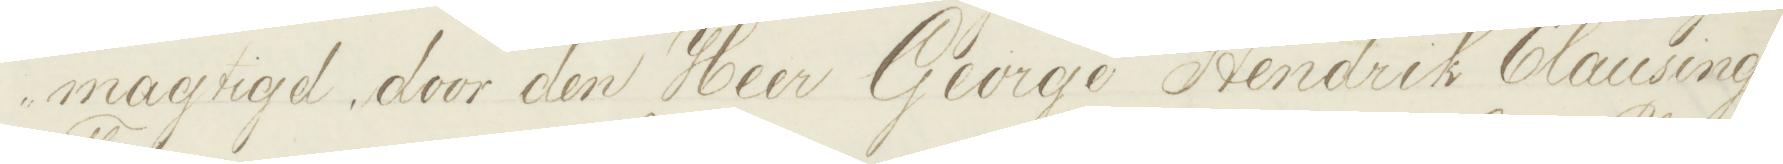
„magtigd, door den Heer George Hendrik Clausing,
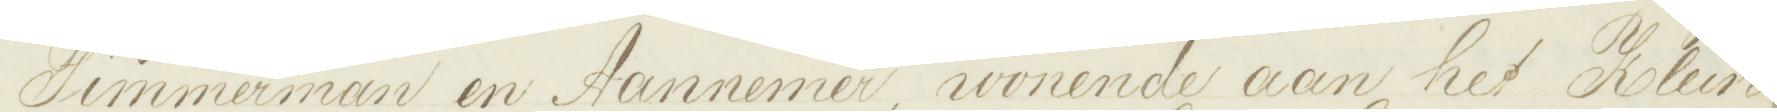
Timmerman en Aannemer, wonende aan het Klein
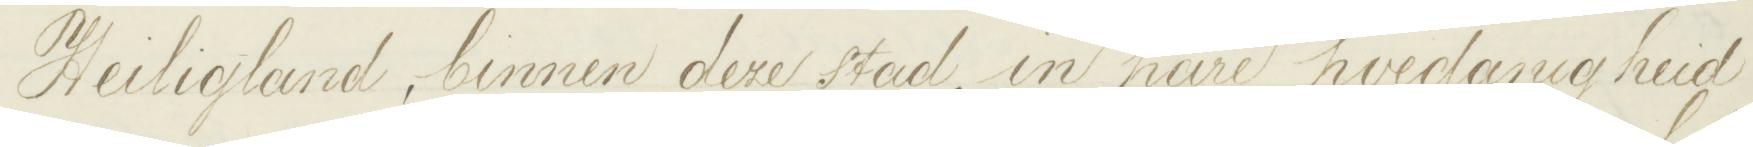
Heiligland, binnen deze stad, in hare hoedanigheid
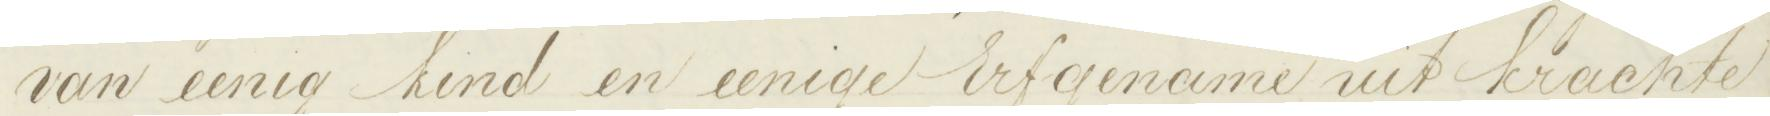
van eenig kind en eenige Erfgename uit krachte
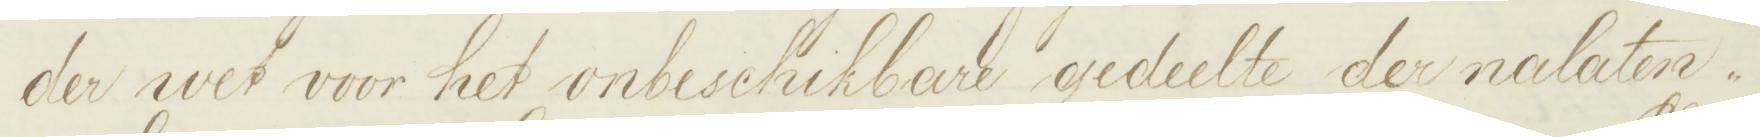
der wet voor het onbeschikbare gedeelte der nalaten„
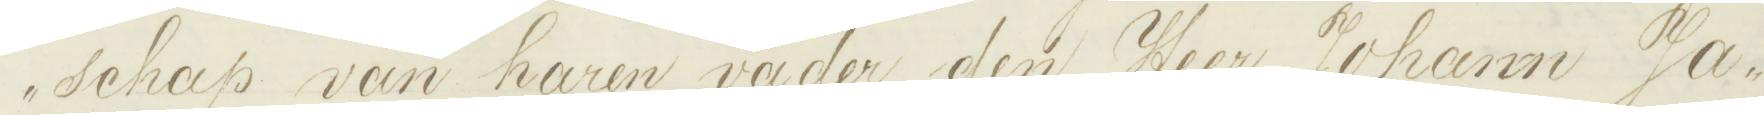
„schap van haren vader den Heer Johann Ja„
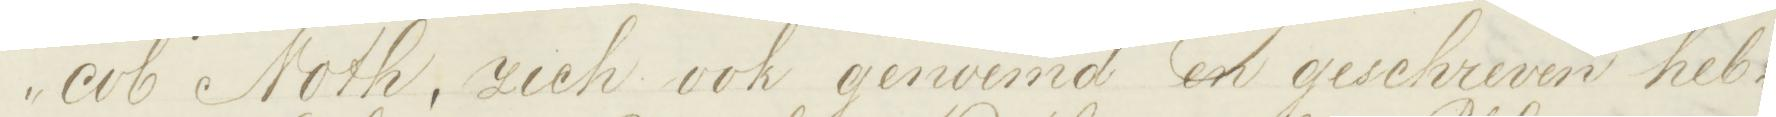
„cob Noth, zich ook genoemd en geschreven heb„
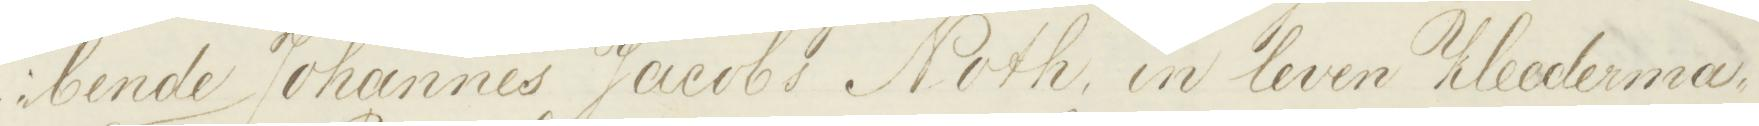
„bende Johannes Jacobs Noth, in leven kleederma„
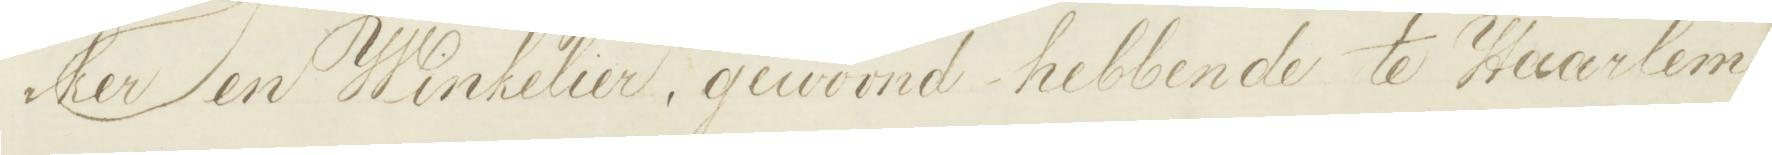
ker en Winkelier, gewoond hebbende te Haarlem,
